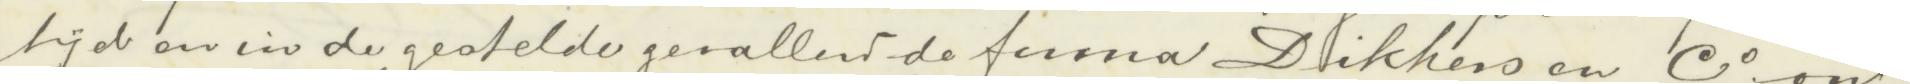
tijd en in de gestelde gevallen de firma Dikkers en C.o on
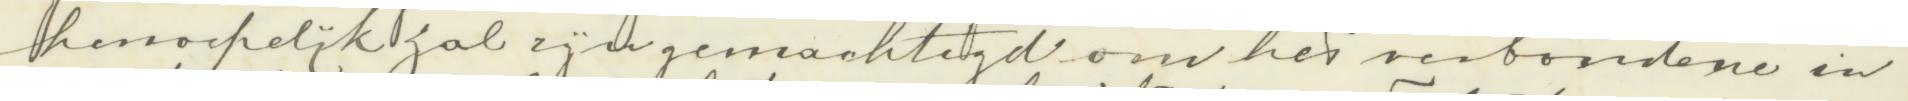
herroepelijk zal zijn gemachtigd om het verbondene in
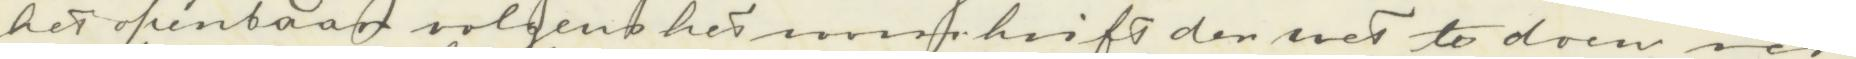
het openbaar volgens het voorschrift der wet te doen ver
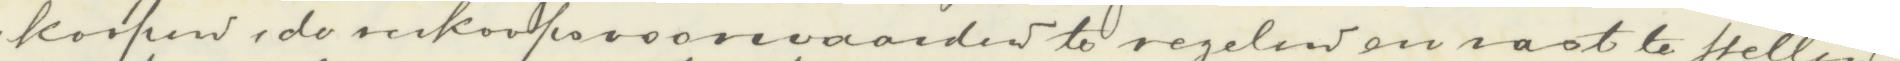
koopen, de verkoopsvoorwaarden te regelen en vast te stellen
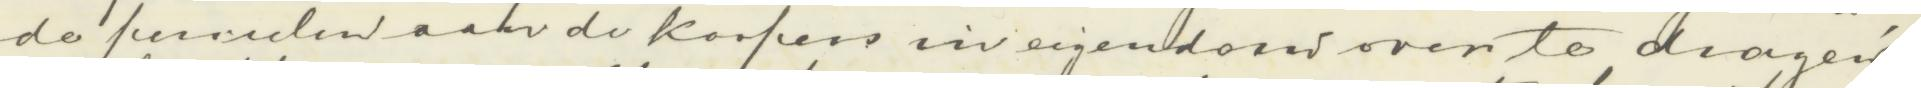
de perceelen aan de koopers in eigendom over te dragen,
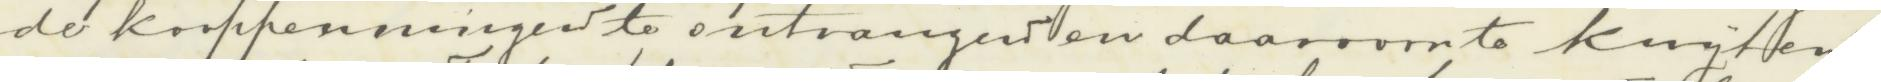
de kooppenningen te ontvangen en daaroor te kwijten,
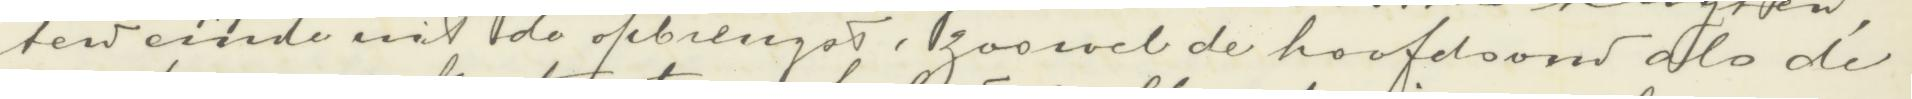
ten einde uit de opbrengst, zoowel de hoofdsom als de
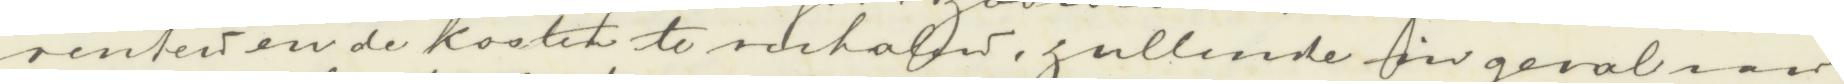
renten en de kosten te verhalen, zullende in geval van
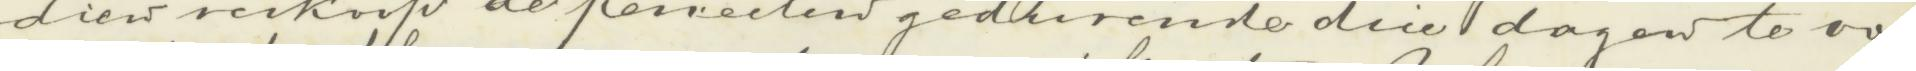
dien verkoop de perceelen gedurende drie dagen te vo
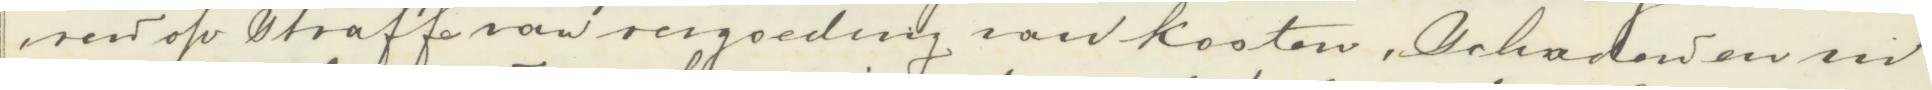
,ren op straffe van vergoeding van kosten, schaden en in
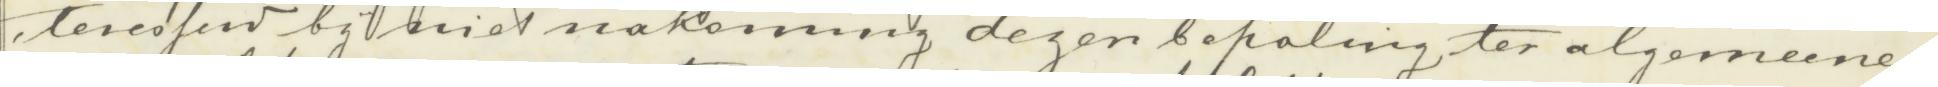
,teressen bij niet nakoming dezer bepaling, ter algemeene
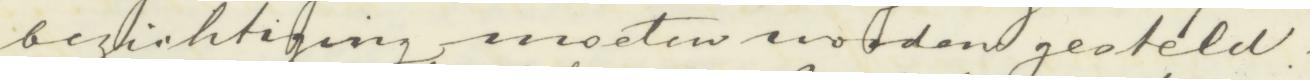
bezichtiging moeten worden gesteld.
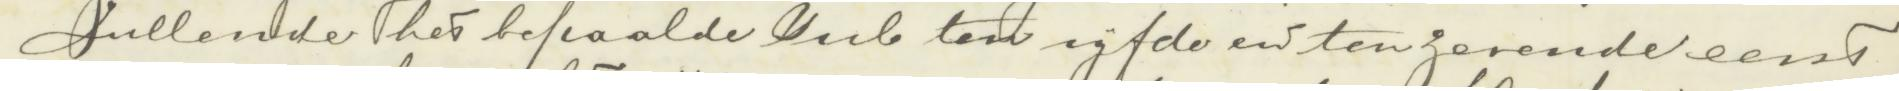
Zullende het bepaalde sub ten vijfde en ten zevende eerst
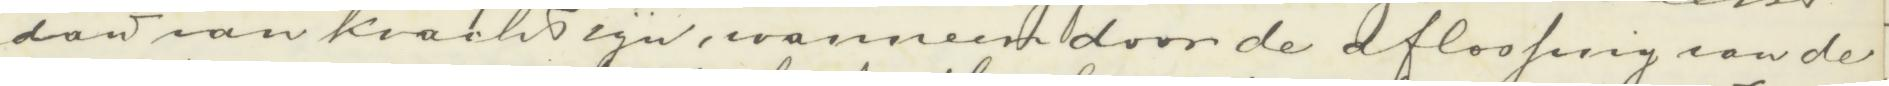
dan van kracht zijn, wanneer door de aflossing van de
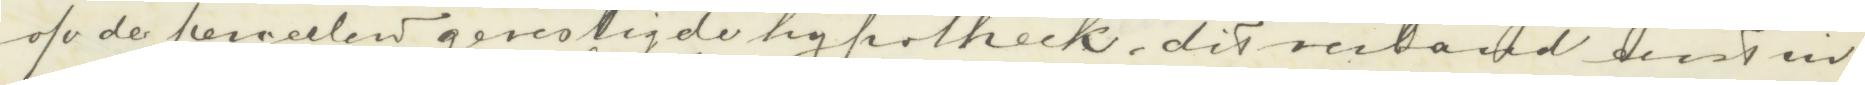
op de perceelen gevestigde hypotheek, dit verband eerst in
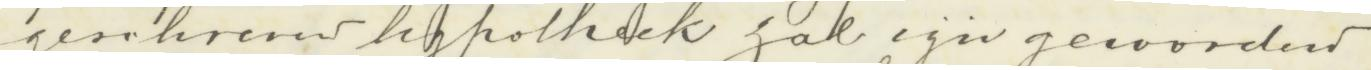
geschreven hypotheek zal zijn geworden
